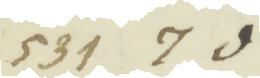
531 7 d
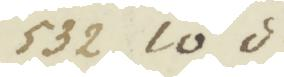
532 10 d
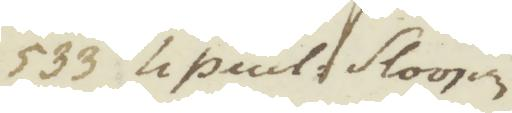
533 4 peul: sloopen
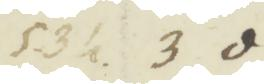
534 3 d
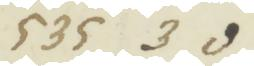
535 3 d
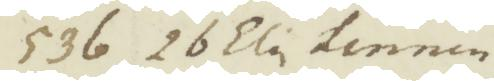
536 26 Een Linnen
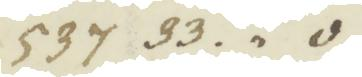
537 33 . .. d
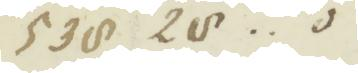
538 28 .. d
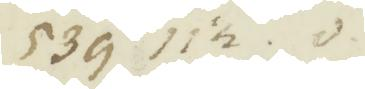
539 11½. d.
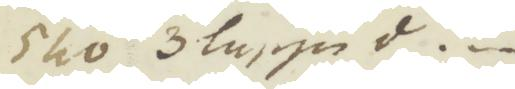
540 3 lappen d. _
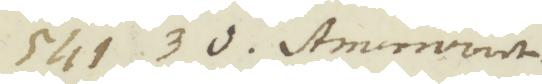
541 38 d. Amersvoort.
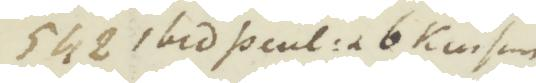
542 1 bed peul: 26 kussen
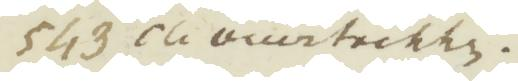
543 di overtrekken.
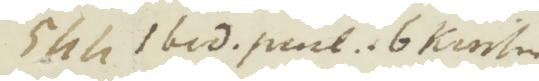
544 1 bed. peul.. 6 kussens
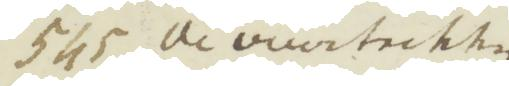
545 14 overtrekken
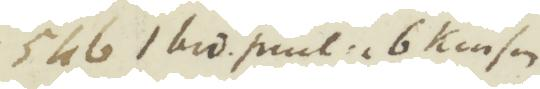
546 1 bed. peul:. 6 kussen
